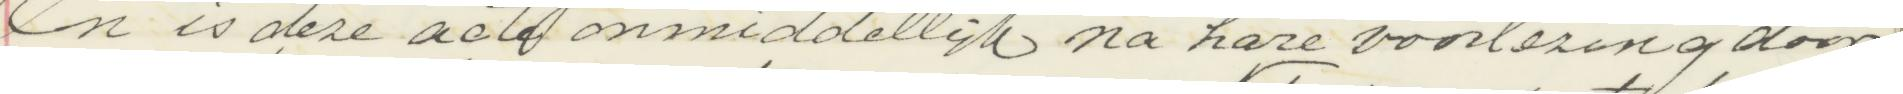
En is deze acte onmiddellijk na hare voorlezing door
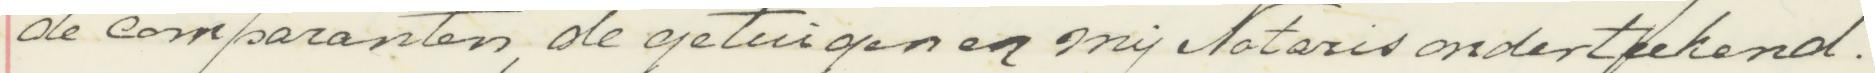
de comparanten, de getuigen en mij Notaris onderteekend.
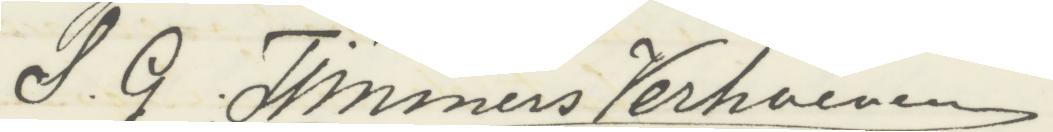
S. G. Timmers Verhoeven
